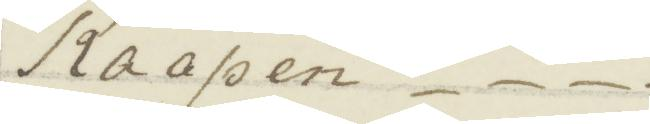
Raapen - - -
